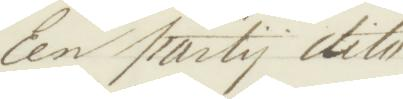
Een partij dito
